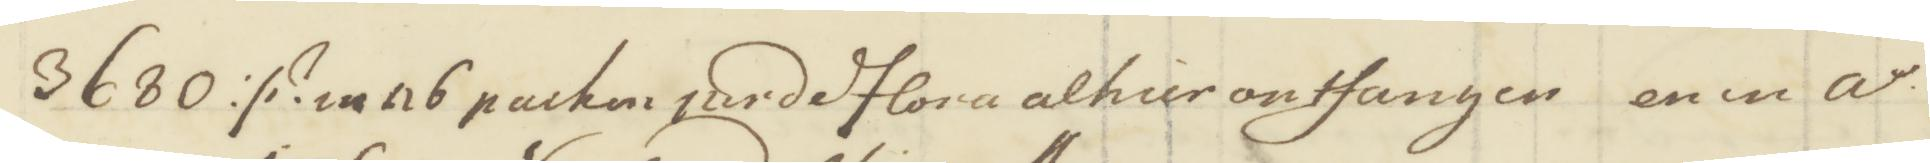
3680: p.' in 46 packen per de Flora alhier ontfangen en in a„o
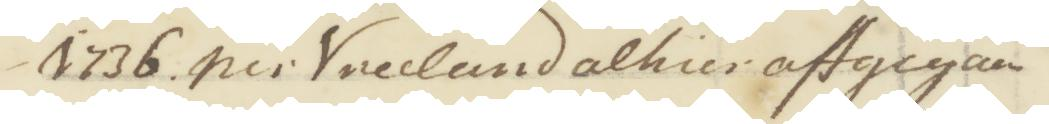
- 1736. per Vreeland alhier affgegaen
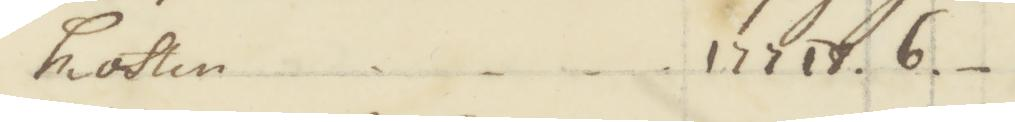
kosten - - - - 17718. 6. —
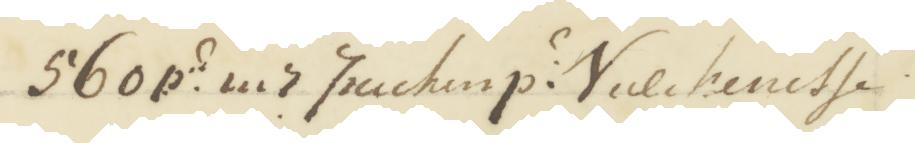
560 p:' in 7. packen p:' Valckenesse.
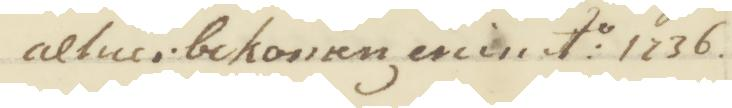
alhier bekomen en in A:o 1736.
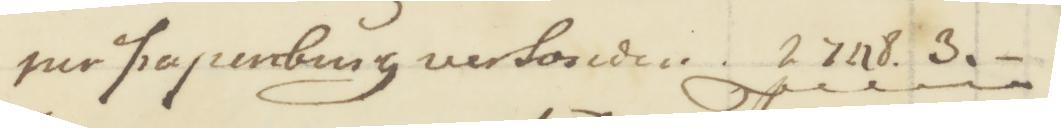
per Papenburg versonden . 2748. 3. —
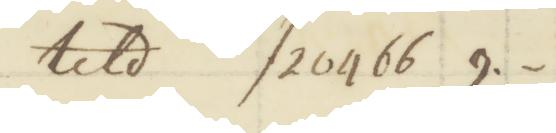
teld ƒ 20466 9. —
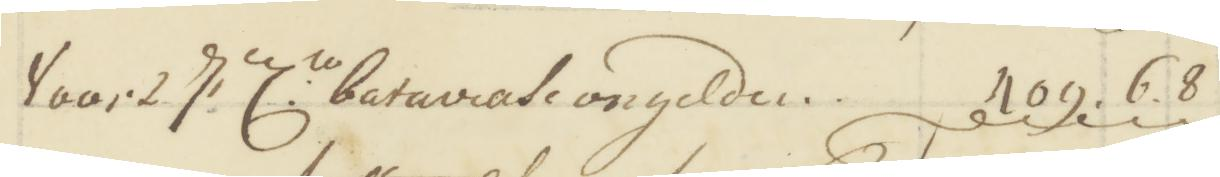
Voor. 2 p:r C:to bataviase ongelden . 409: 6. 8
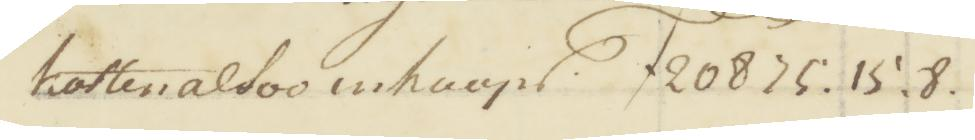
kosten alsoo inkoops. ƒ 20875. 15. 8.
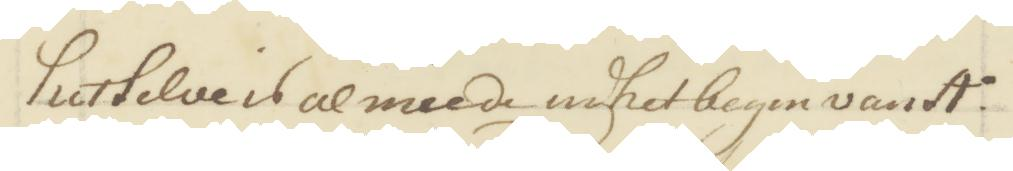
hetselve is al meede in het begin van A.o
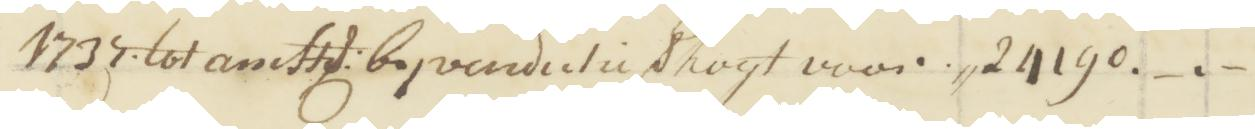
1737. tot amst: by vendutie verkogt voor . „ 24190. —. —
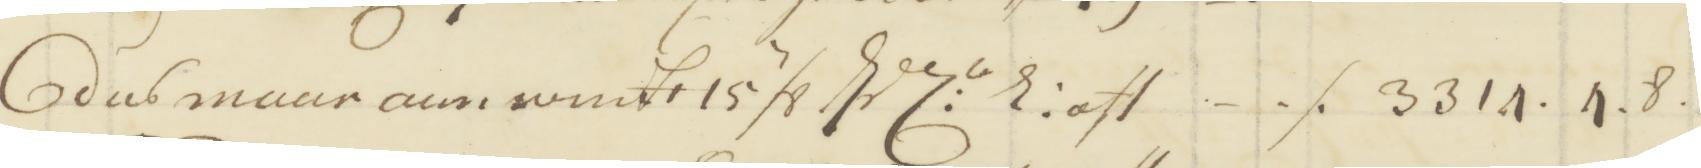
das maar aan winst 15 7/8 pr C:to h: oft .—. - ƒ 3314. 4. 8.
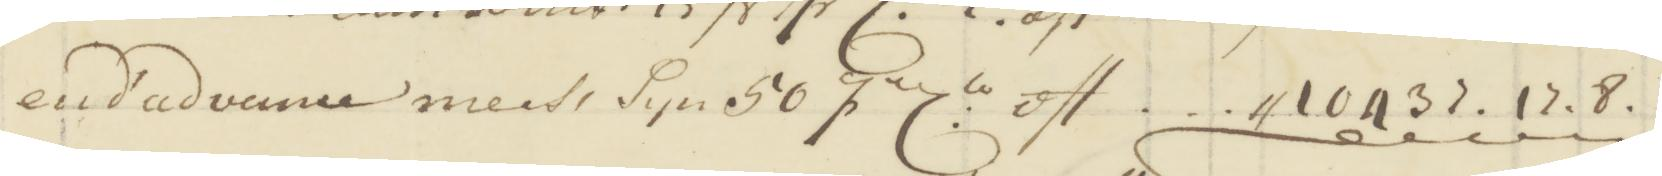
en d'advance meest, syn 50 pr C:to oft . . . „ 410437. 17. 8.
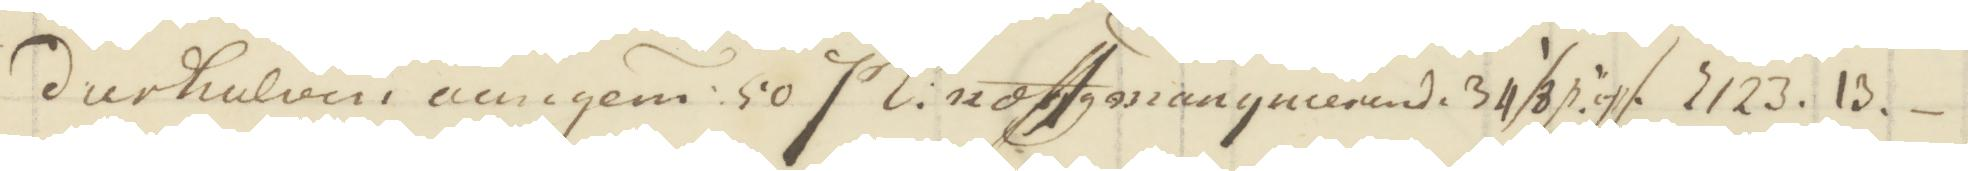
dierhalven aangem: 50 p pr C:to n oftgemanqueerende 34 1/8. p.' oft ƒ 7123. 13. —
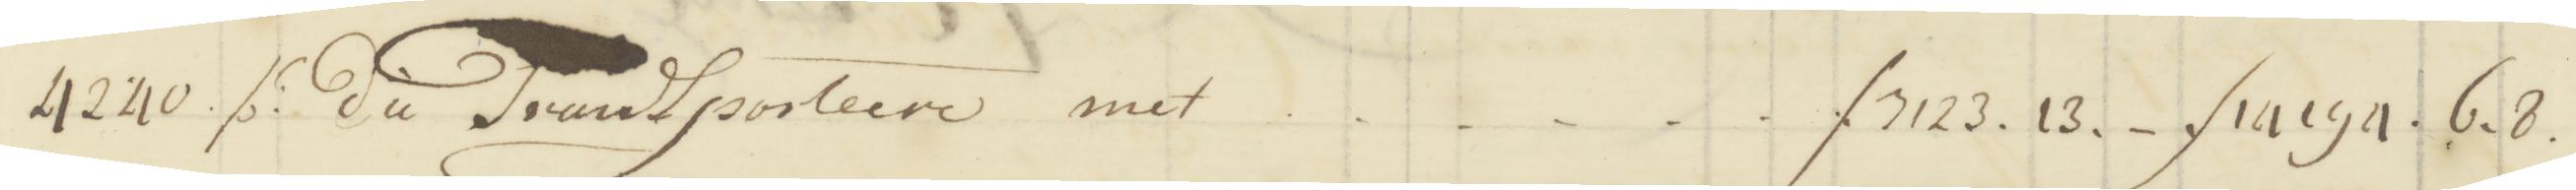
4240 p:' du Transporteere met . . . . . . ƒ 3123.13. — ƒ 14194. 6. 8.
